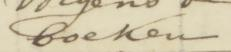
boeken
